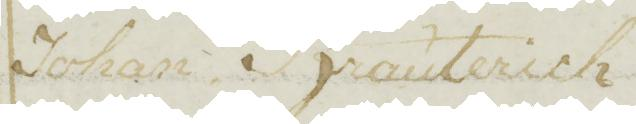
Johan Brauterich
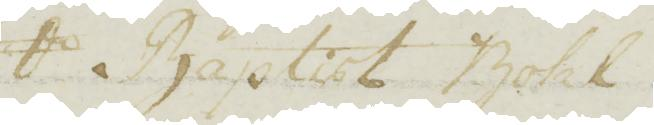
d=o Baptist Bohl
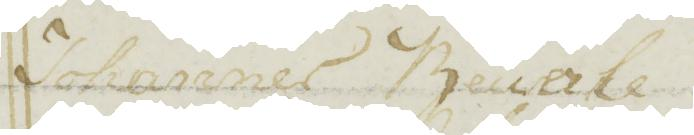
Johannes Beuerle
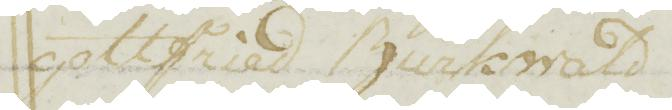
gottfried Burkwald
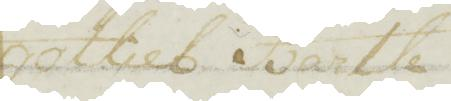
gotlieb Barth
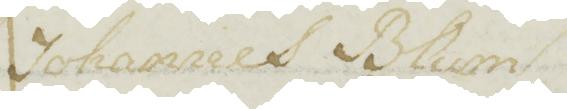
Johannes Blum
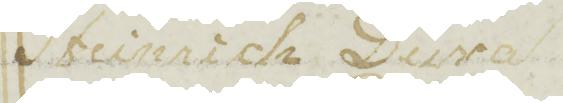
Heinrich Dura
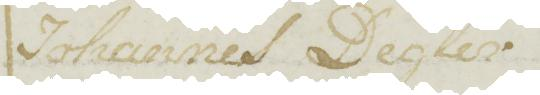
Johannes Degler
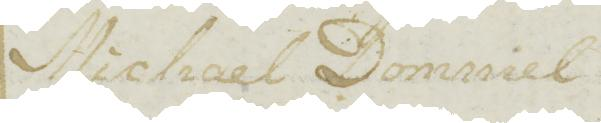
Michael Domniel
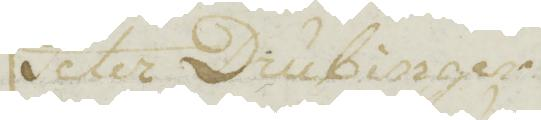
Peter Drubinger
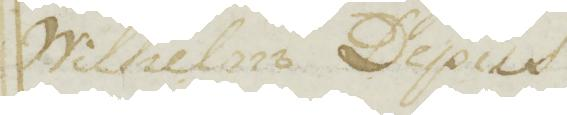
Wilhelm Depus
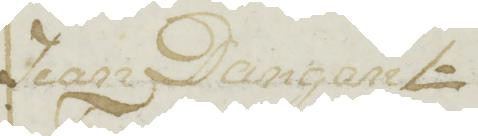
Jean Dangent
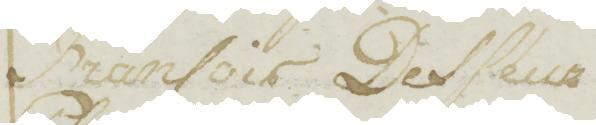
Francois Desseur
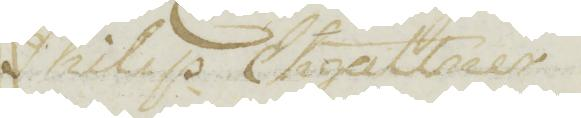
Philip Ehgattner
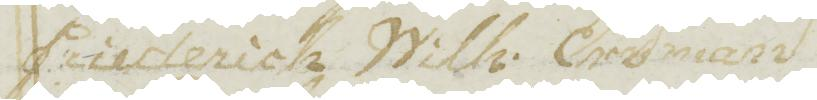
friederich Wilh. Erdman
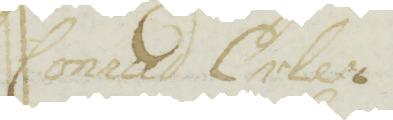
Conrad Erler
